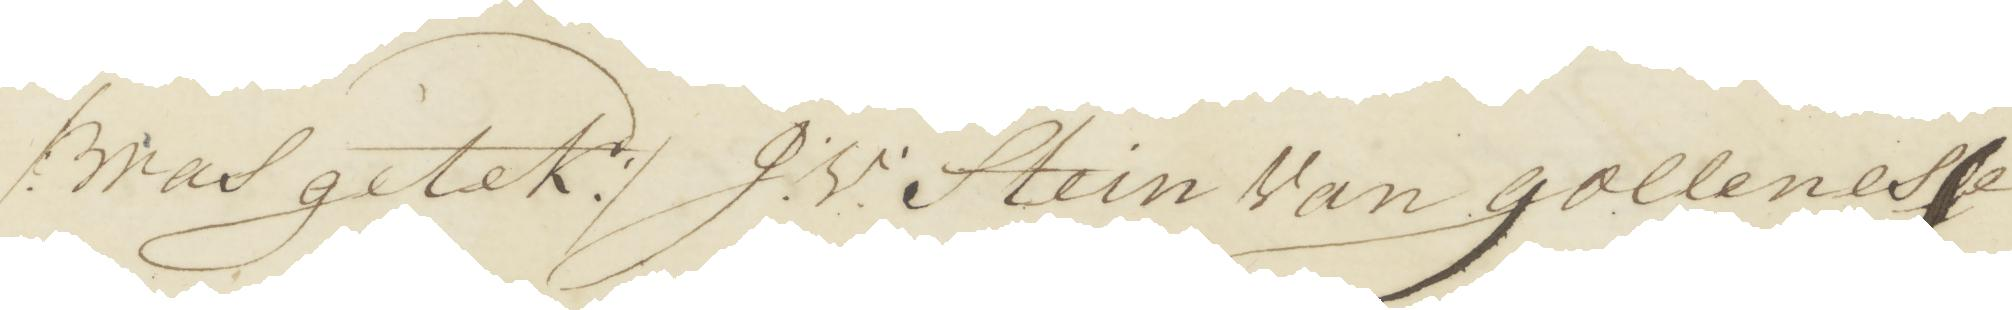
/:was getek:s/ J: V: Stein van gollenesse
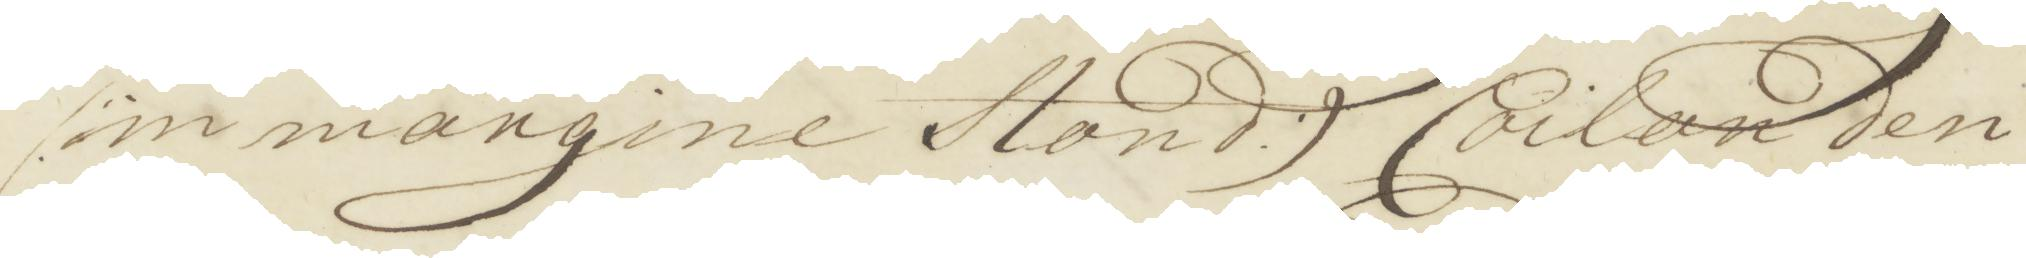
/:in margine stond:/ Coilan den
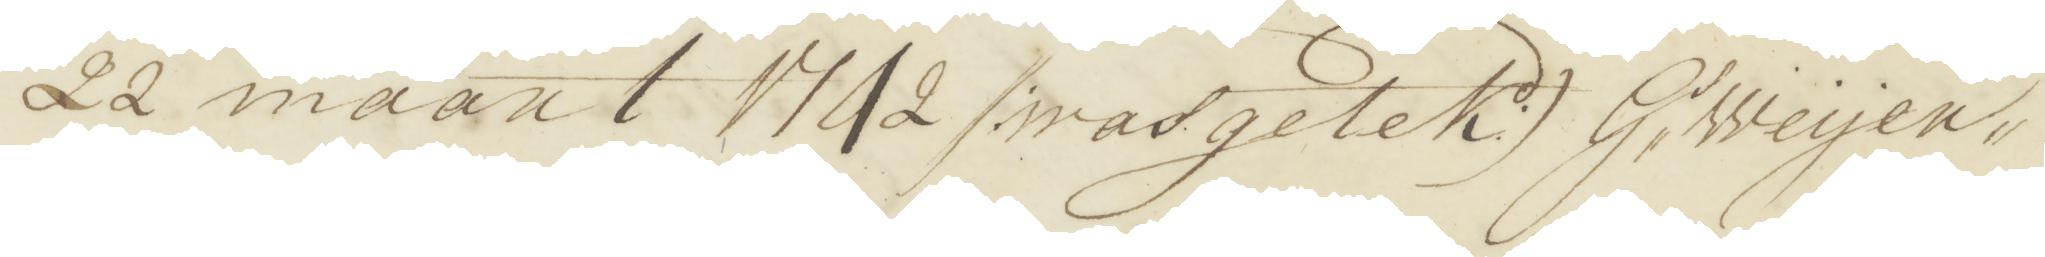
22 maart 1742 /:was getek:d)/ G:s weijer„
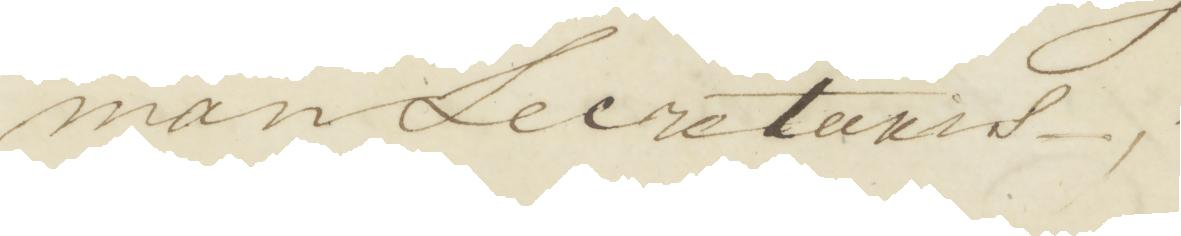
man Secretaris—,
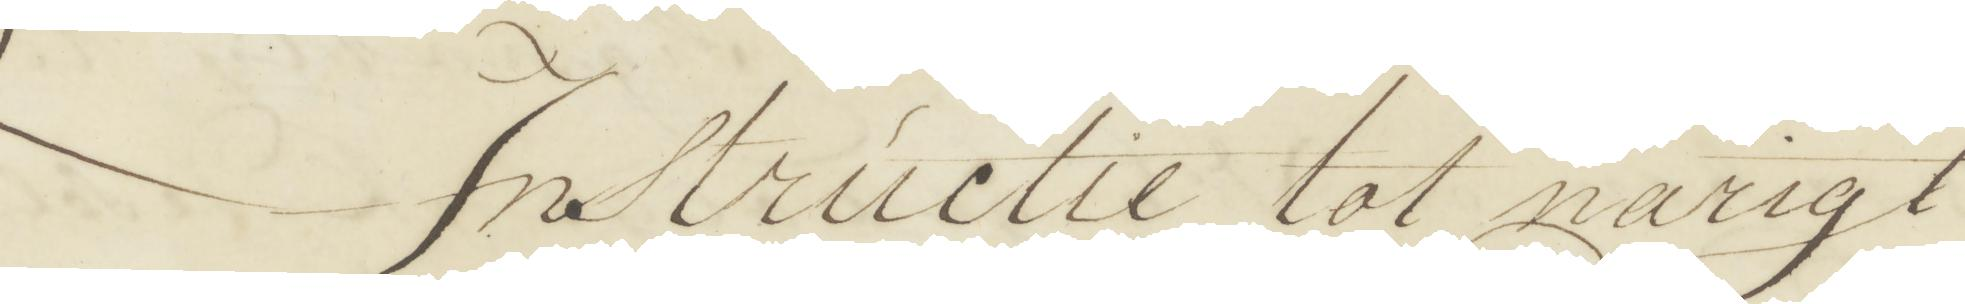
Jstructie tot narigt
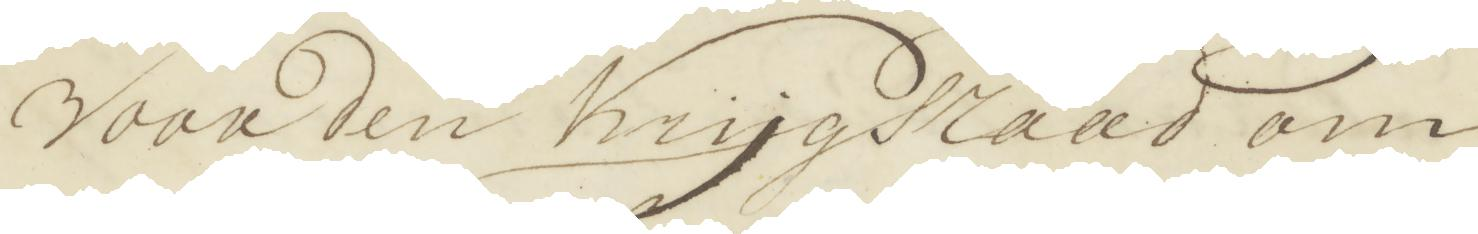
voor den Krijgsraad om
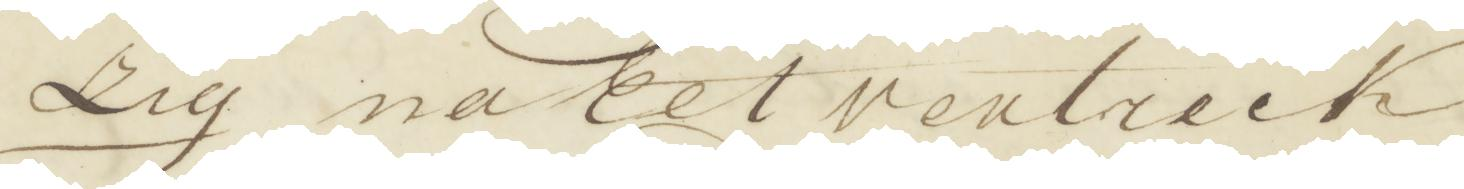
zig na het vertreck
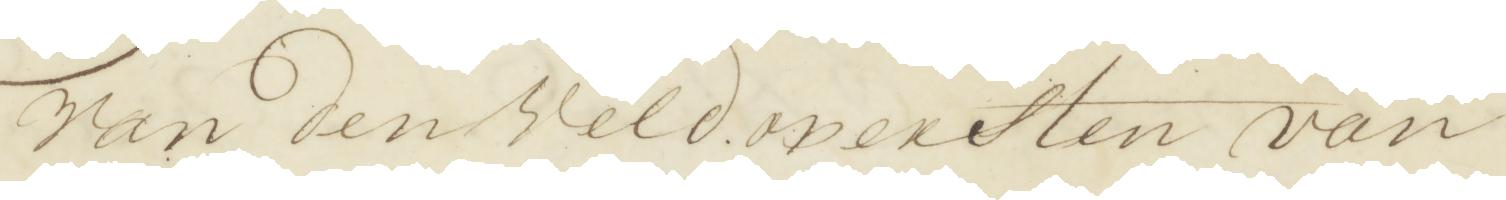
van den veldoversten van
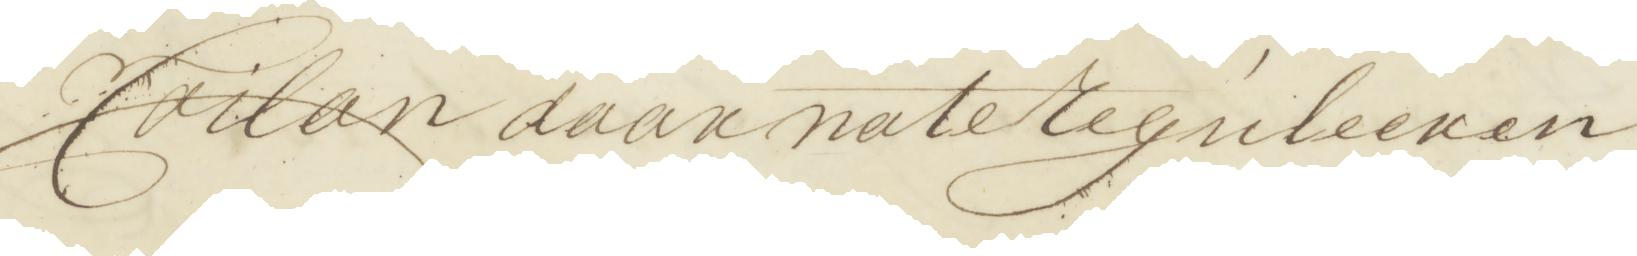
Coilan daar nate reguleeren
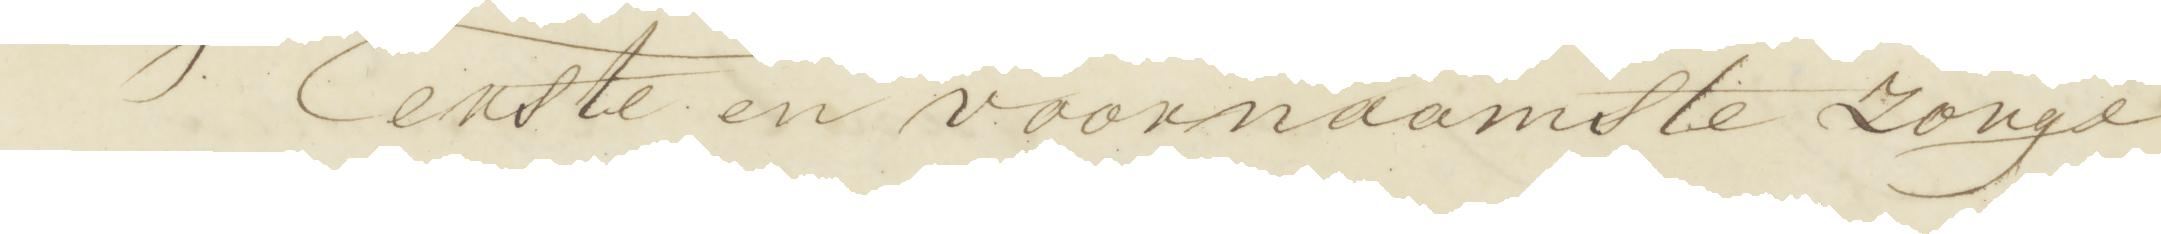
d'Eerste en voornaamste zorge
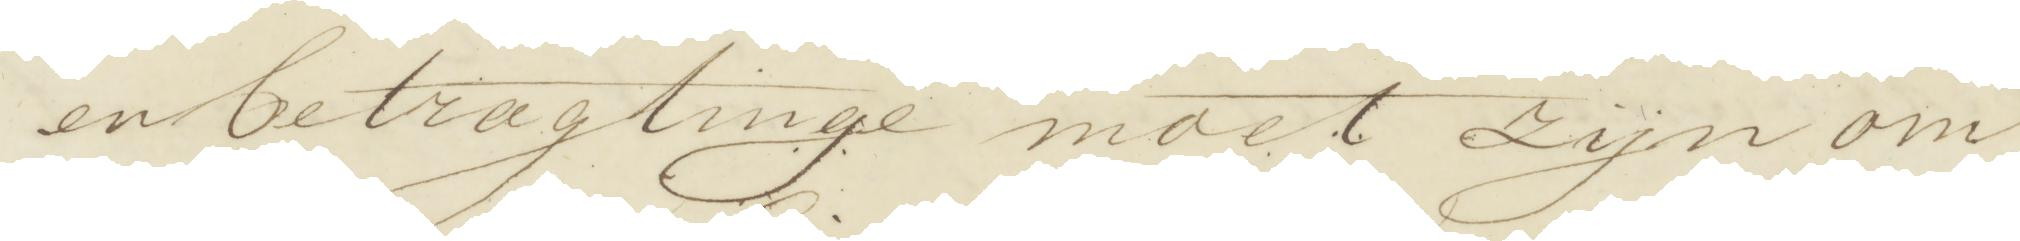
en betragtinge moet zijn om
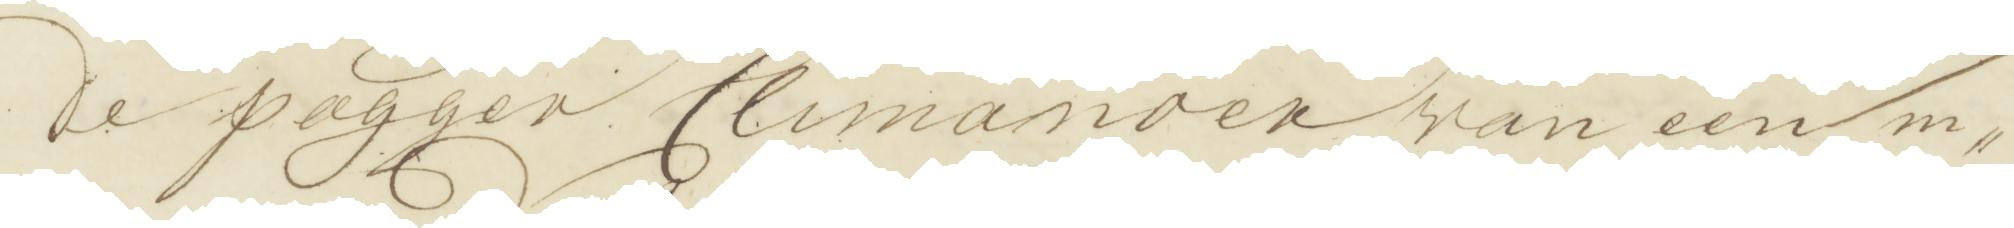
de pagger Climanoer van een 8/m„
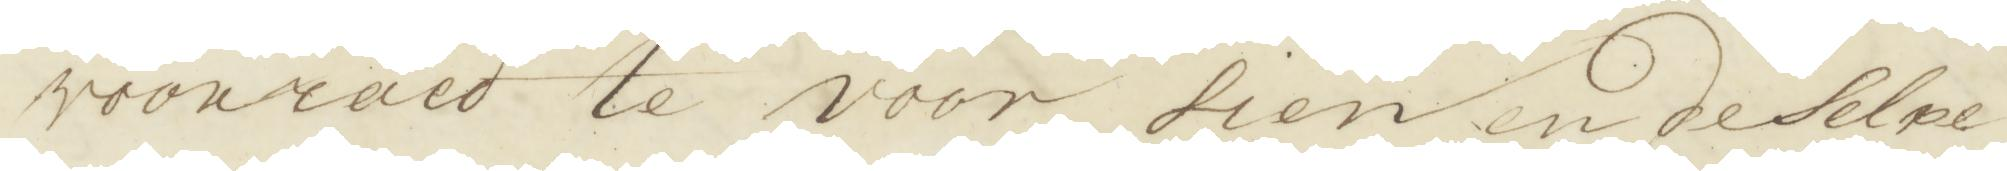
voorraed te voor sien en deselve
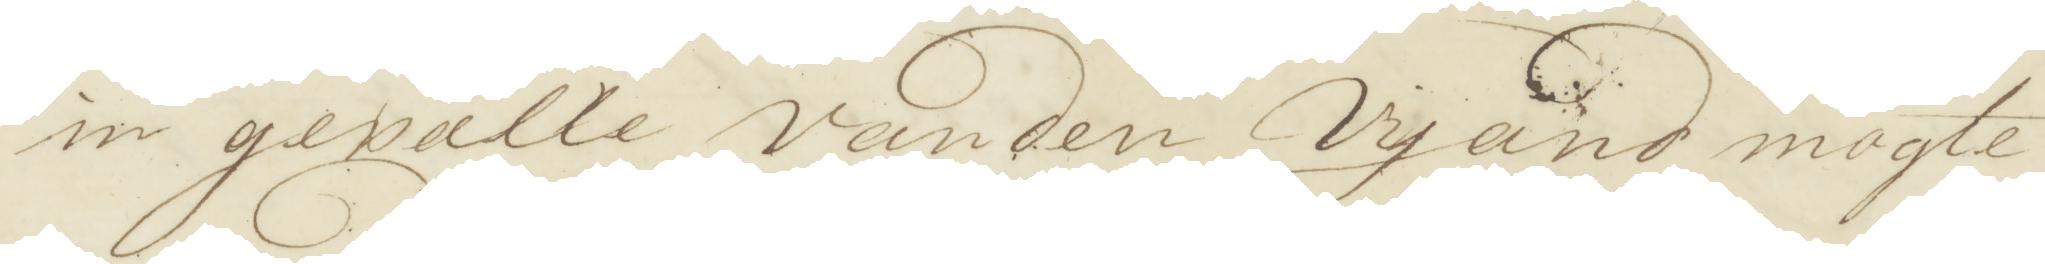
in gevalle van den vijand mogte
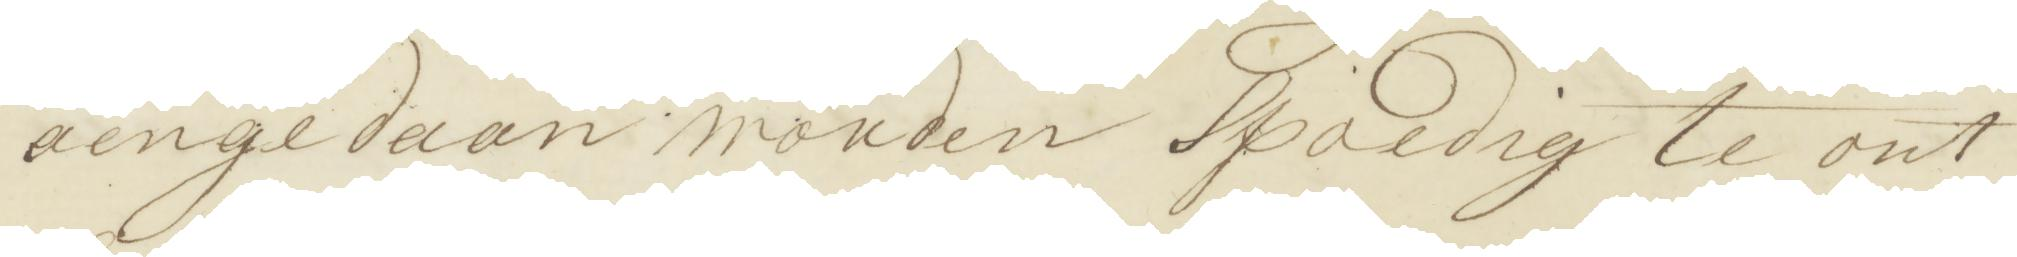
aengedaan worden spoedig te ont
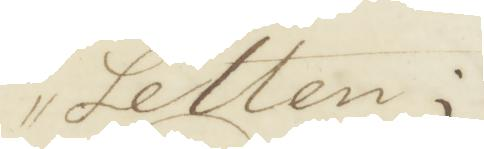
„setten;
